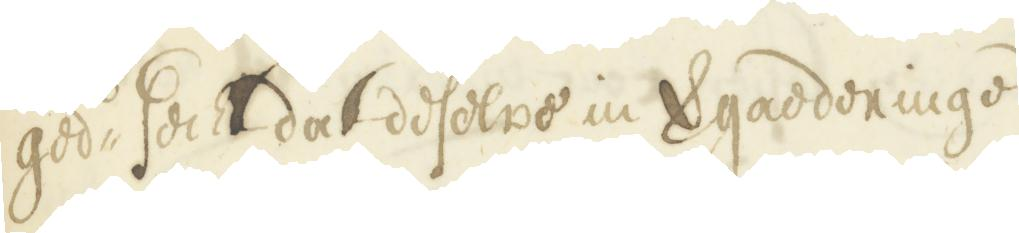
ged„e secht dat deselve in vergaederinge
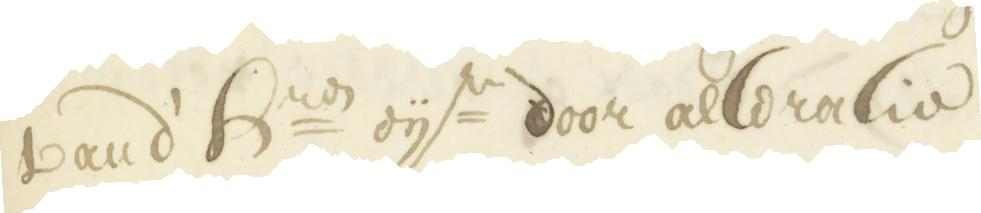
van d’ H=ren Eij=r door alteratie
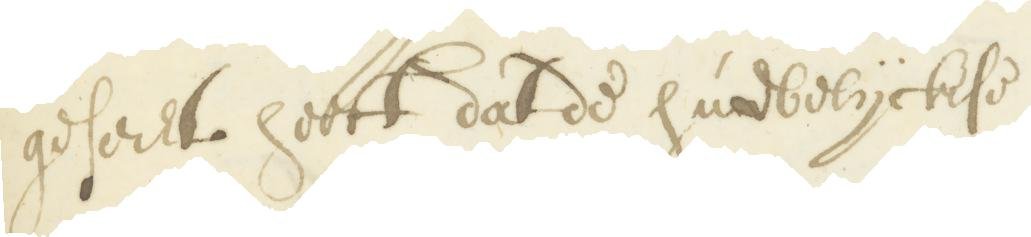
gesecht heeft dat de huwelijckse
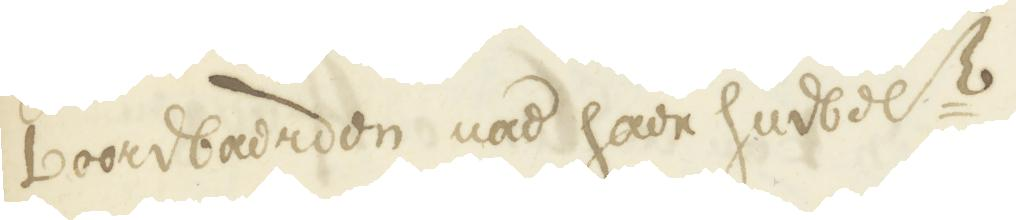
voorwaerden nae haer huwelijk
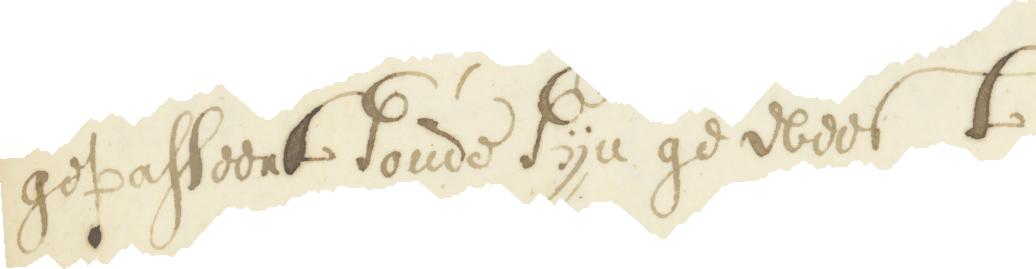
gepasseert soude sijn geweest
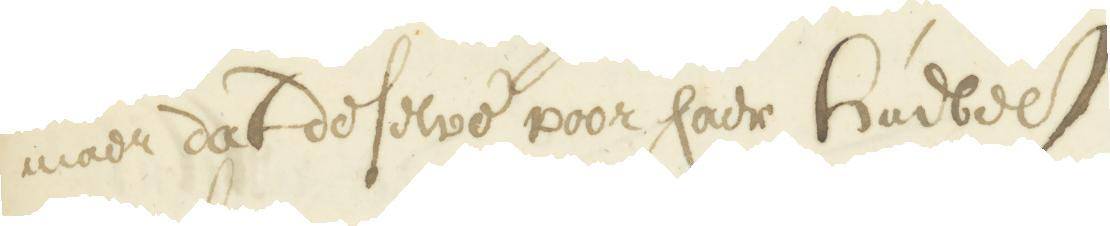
maer dat deselve voor haer huwelijk
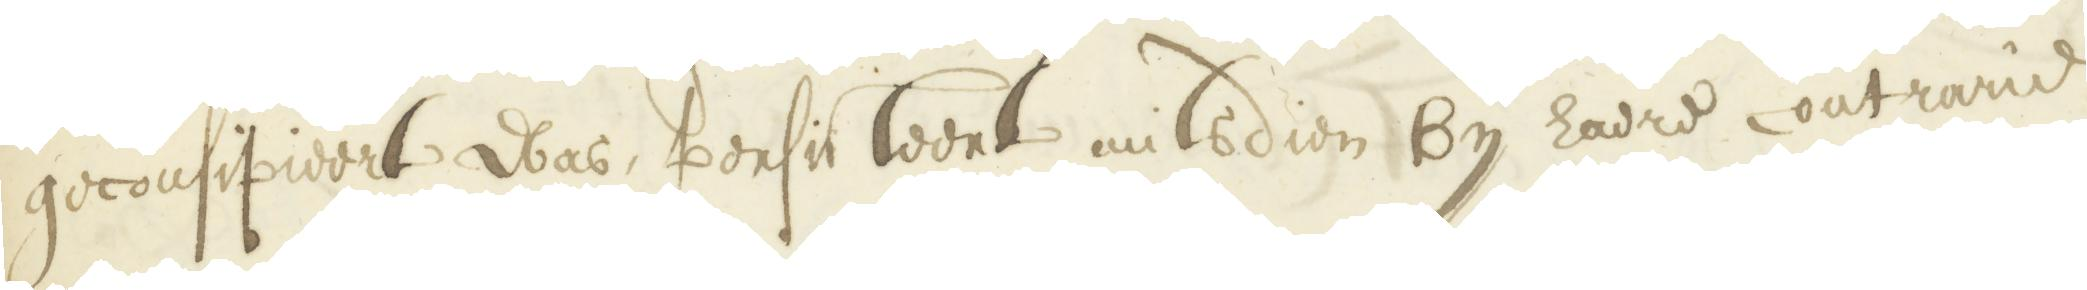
geconsipieert was, persisteert mitsdien bij haere contrarie
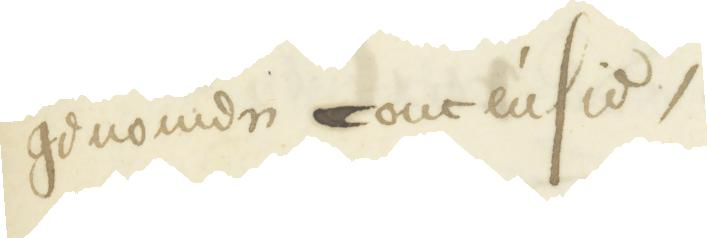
genomen conclusie /
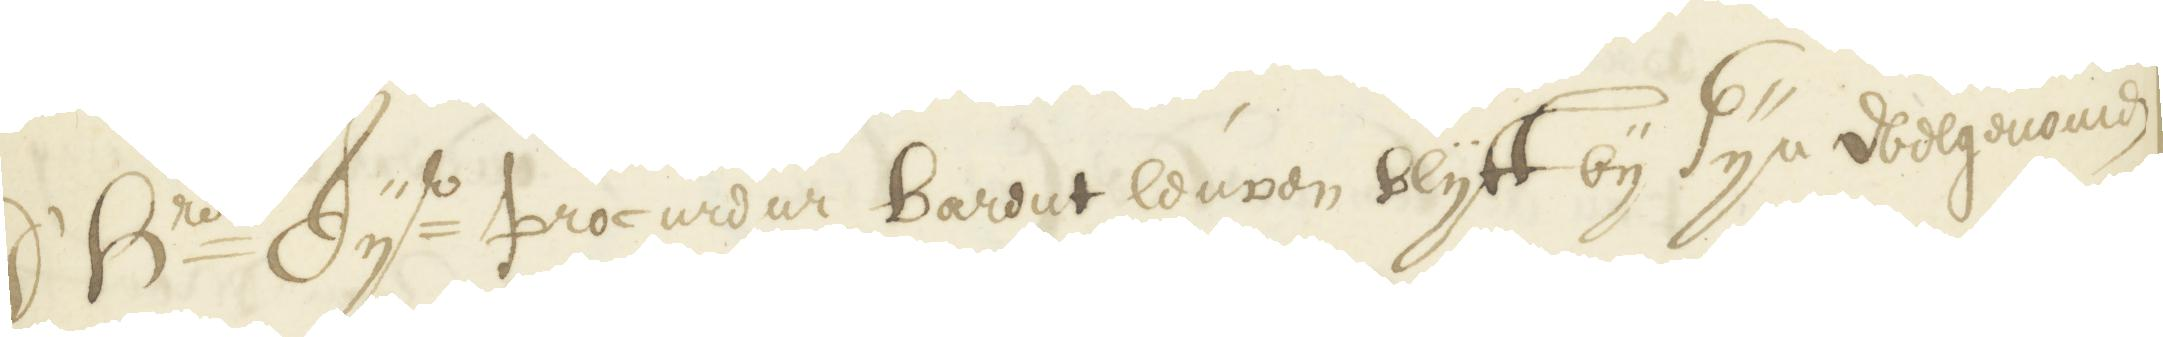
d’ H=ren Eij=r procureur barent leuven blijft bij sijn welgenomen
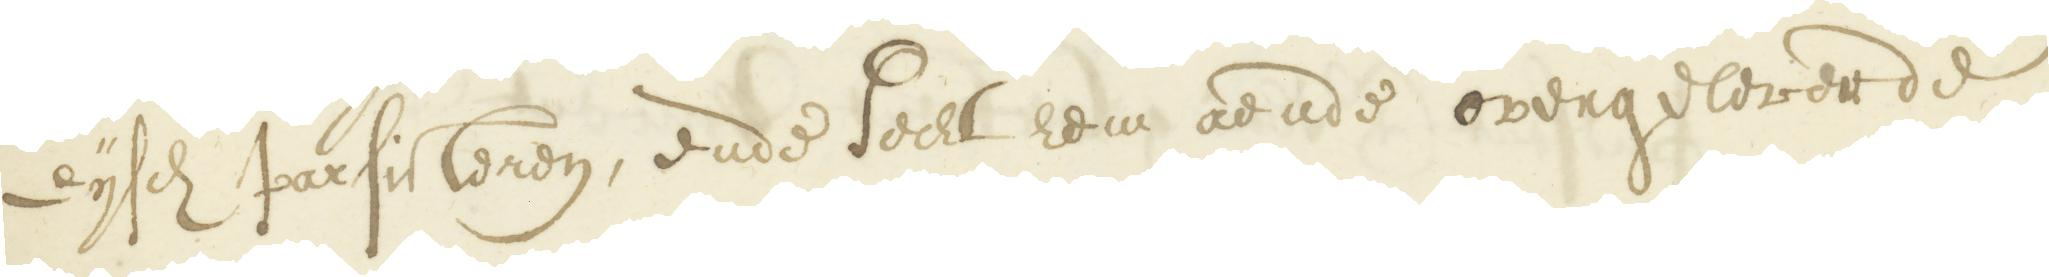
eijsch parsisteren, ende secht hem aende overgeleverde
